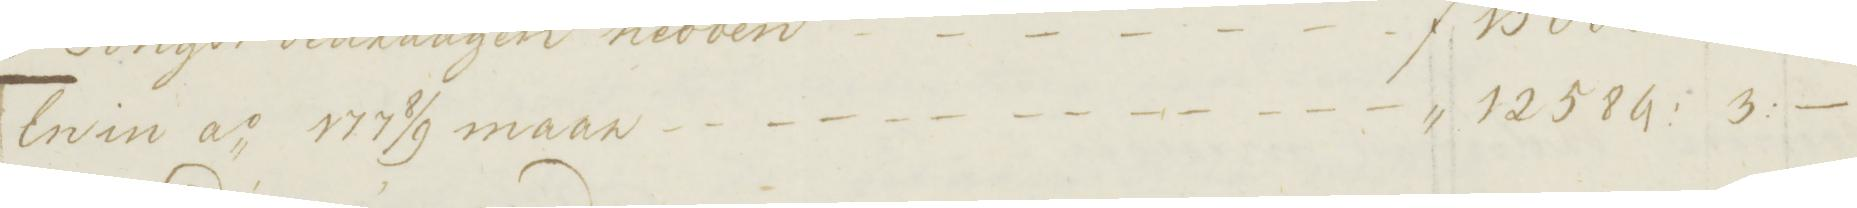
En in a„o 1778/9 maar - - - - - - - - - - - - - „ 12584: 3: —
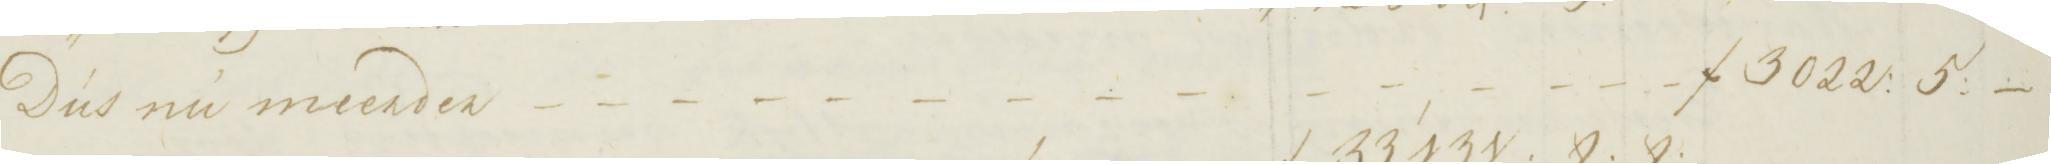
Dus nu meerder - - - - - - - - - - - - - - - ƒ 3022: 5: —
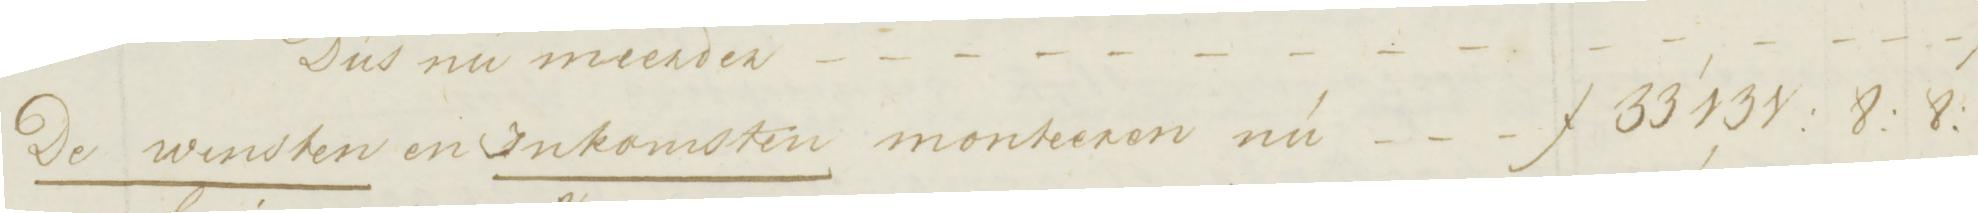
De winsten en Inkomsten monteeren nu - - - ƒ 33'131: 8: 8:
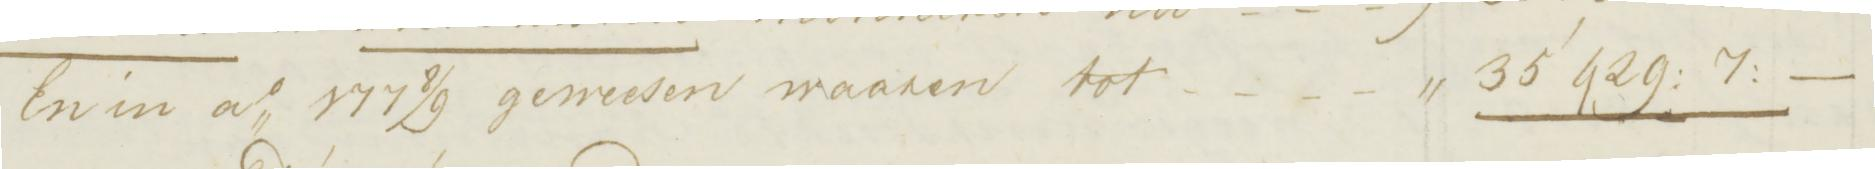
En in a„o 1778/9 geweesen waaren tot - - - - „ 35'429: 7: —
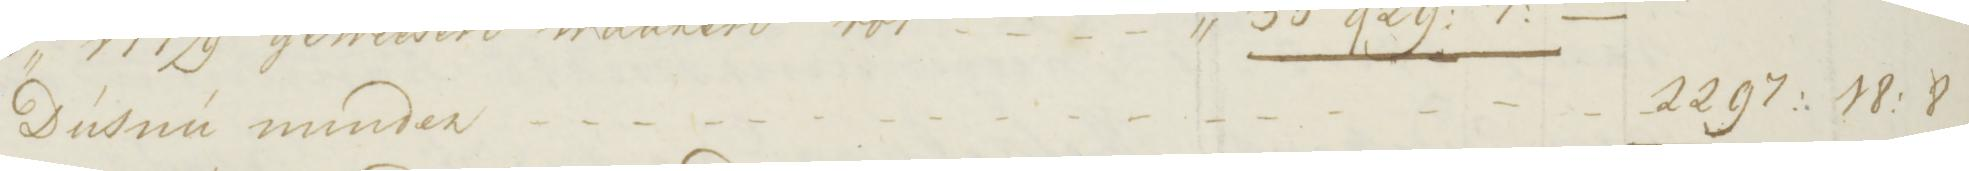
Dus nu minder - - - - - - - - - - - - - - - - - 2297: 18: 8
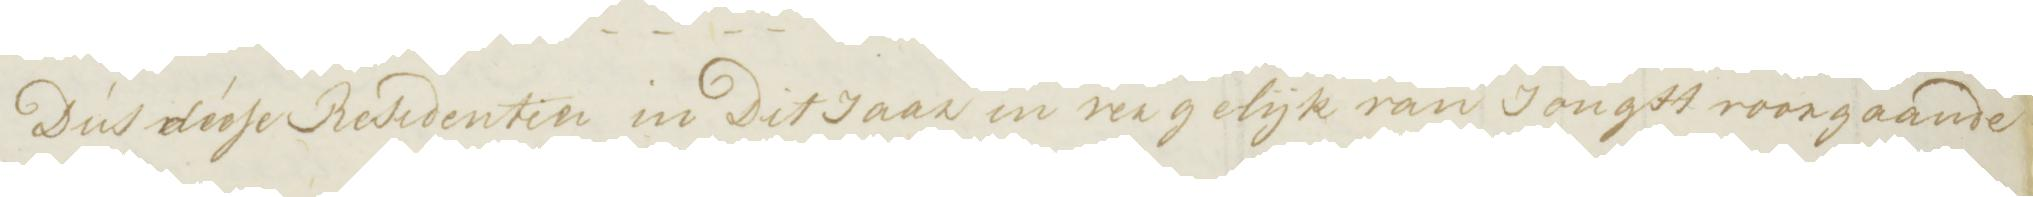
Dus deese Residentie in Dit Iaar in vergelijk van Iongst voorgaande
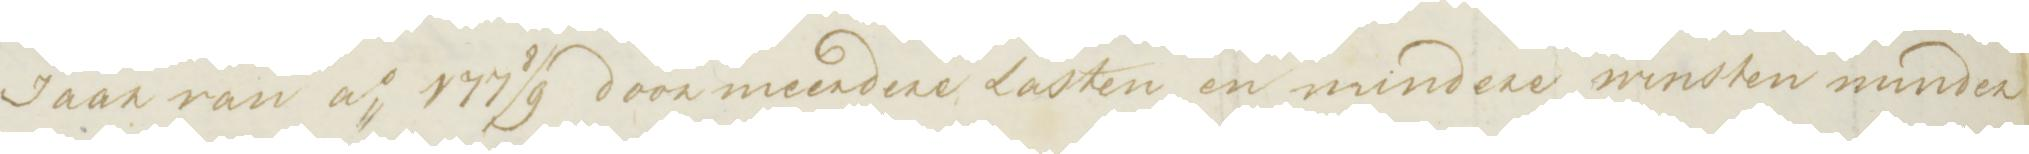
Iaar van a„o 177 8/9 door meerdere Lasten en mindere winsten minder
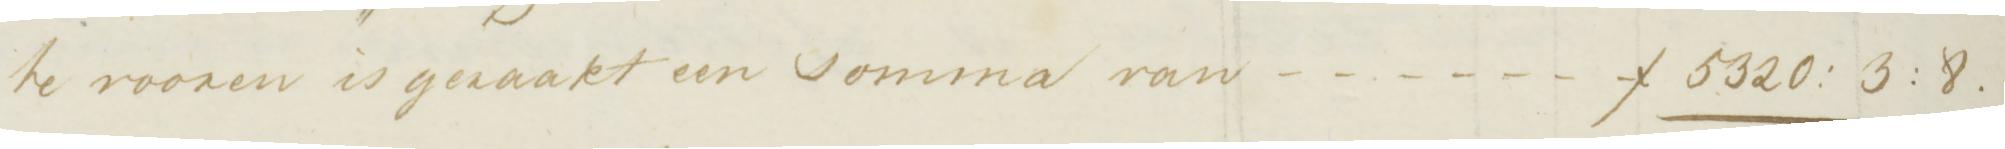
te vooren is geraakt een somma van - - - - - - - ƒ 5320: 3: 8.
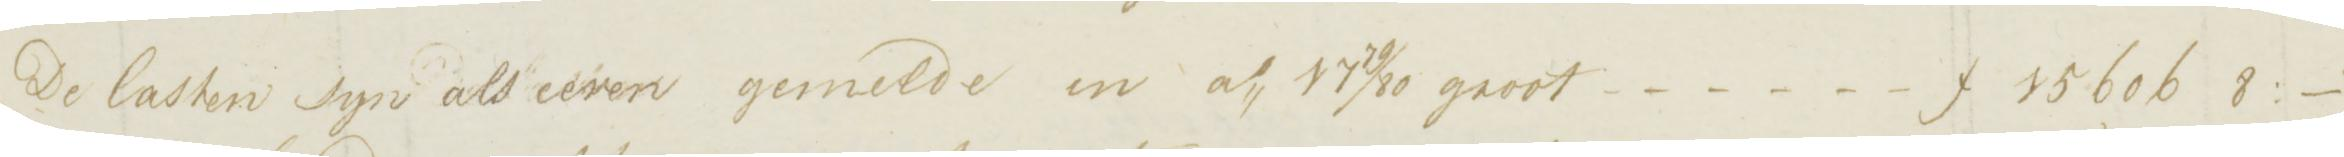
De lasten zijn als eeven gemelde in a„o 17 70/80 groot - - - - - - ƒ 15606 8: —
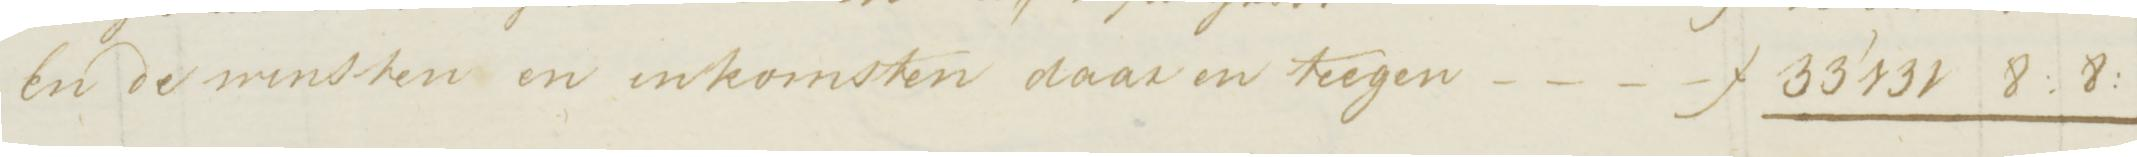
En de winsten en inkomsten daar en teegen - - - - ƒ 33'131 8: 8:
